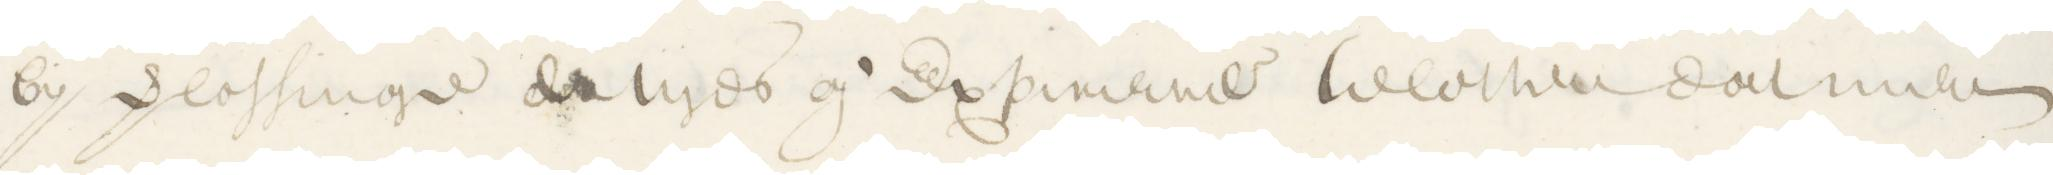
bij verlossinge den tijds g’Expireme te letten dat men
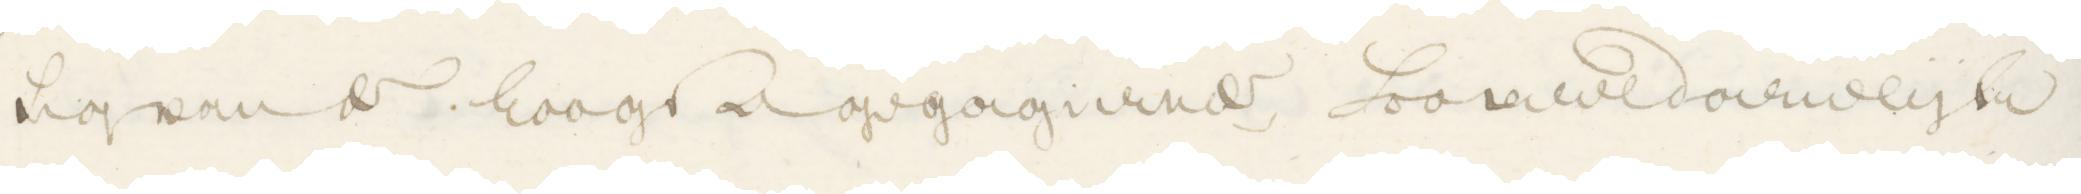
sig van den hoogst gegagieerde, soo weldoenelijk
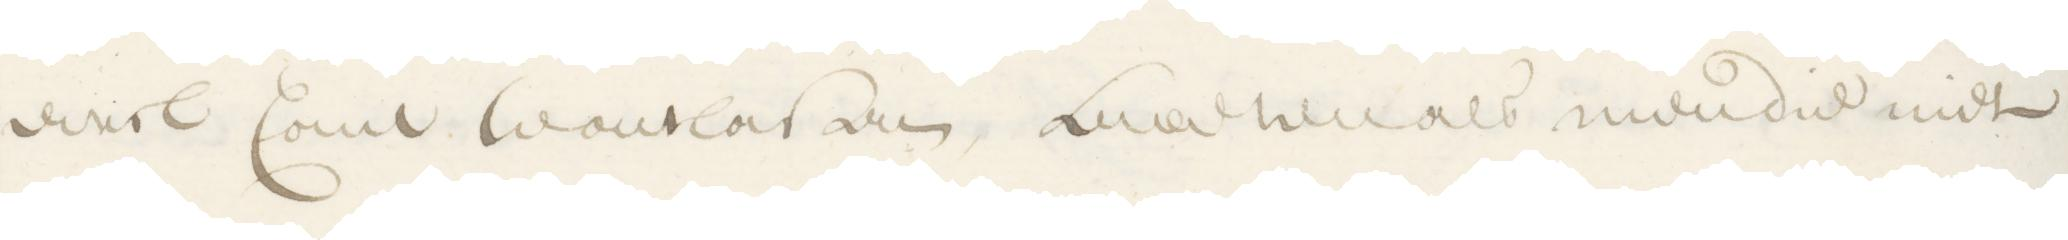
eerst Comt te ontlasten, te weten als men die niet
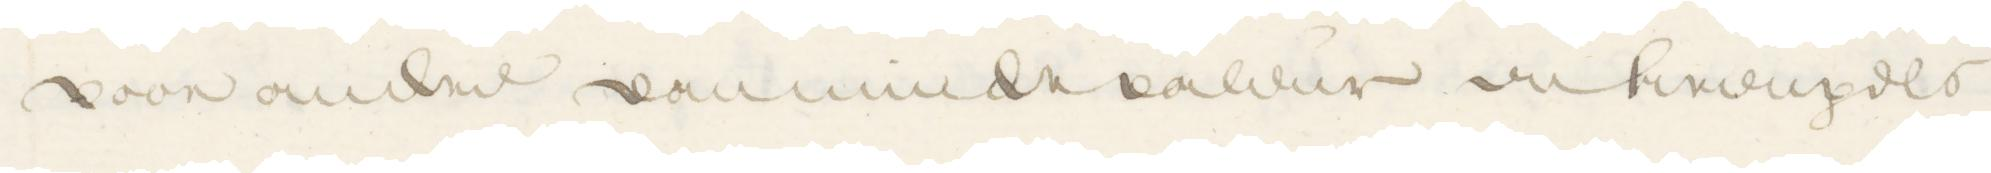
voor andere van minder valeur en kreuxels
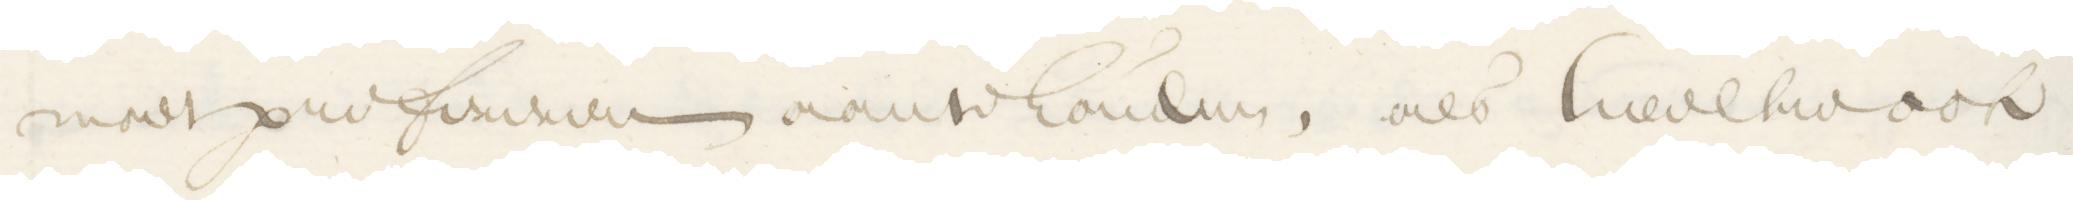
moet prefereren aan tehouden, als twelke ook
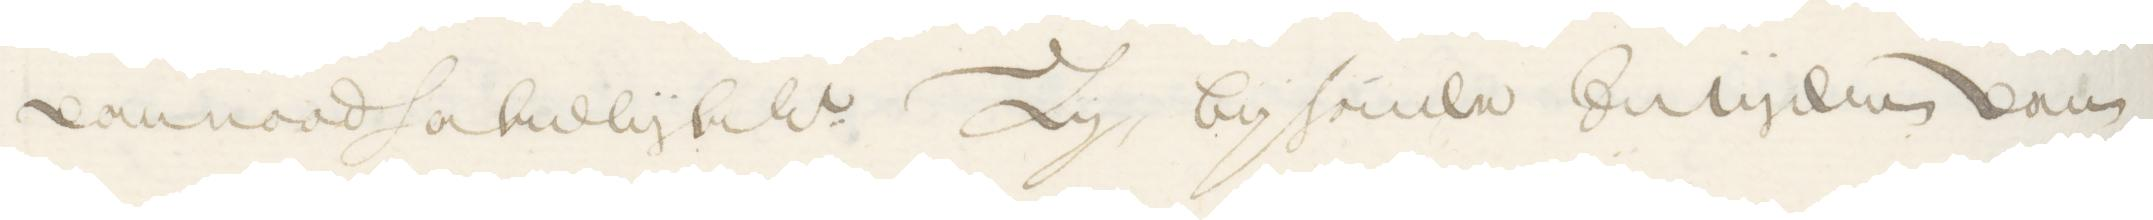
van noodsakelijkh:t Zij, bijsonder Intijden van
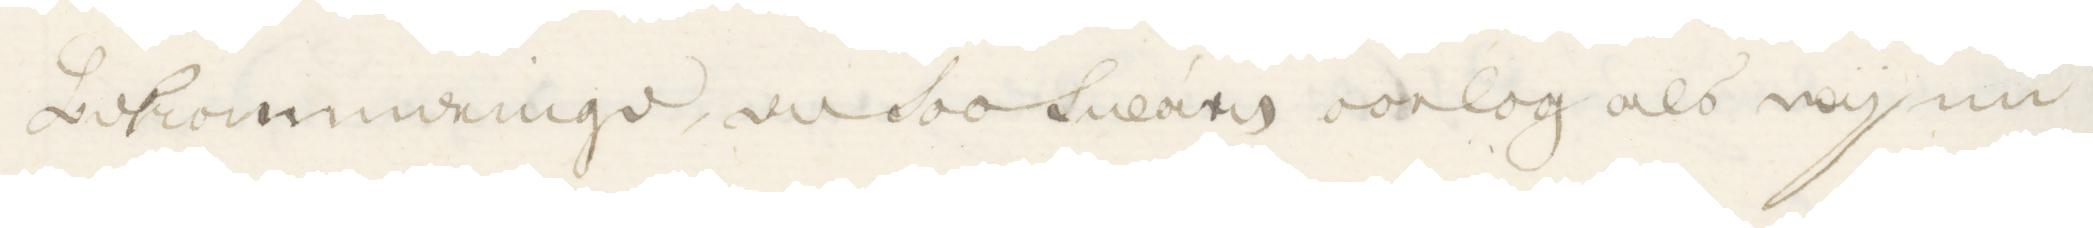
bekommeringe, en soo swaren oorlog als wij nu
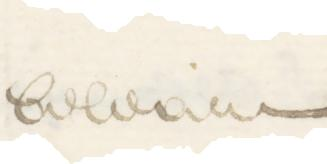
beleven
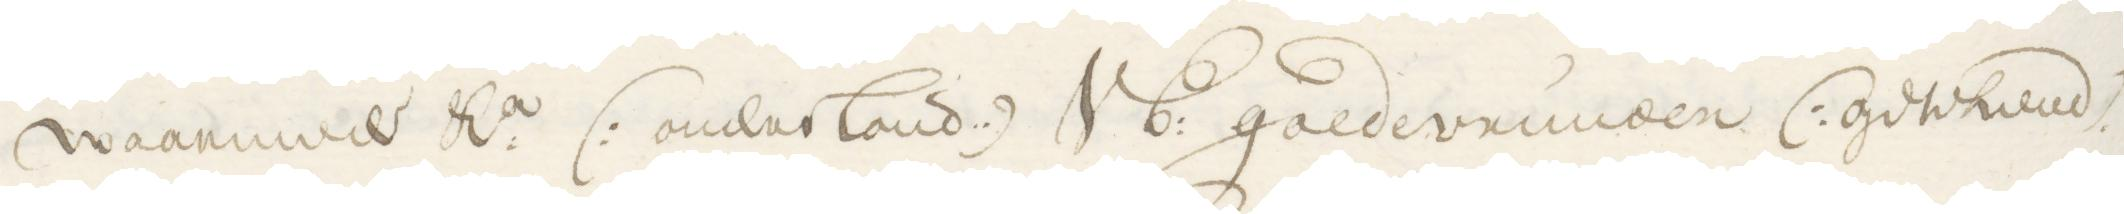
waarmede H:a (: onderstond..) UE: goedevrunden (:getekend).
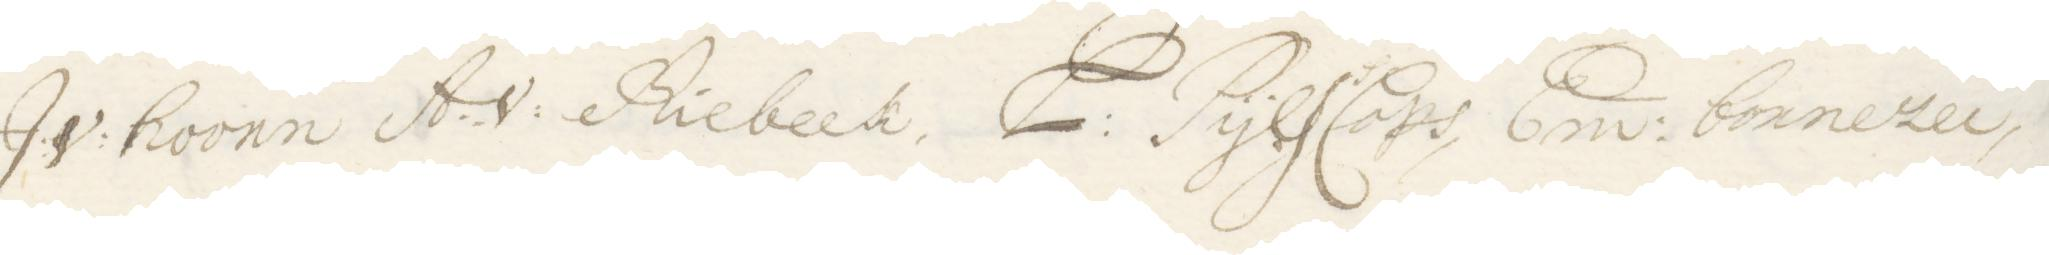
J:v: hoorn A:V: Riebeek, L: Pijl J:Cops, Em: Bornezee,
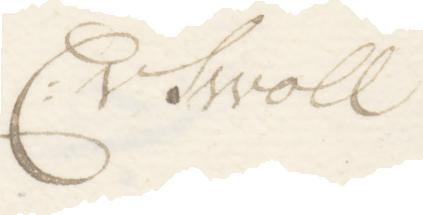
C: v Swoll
